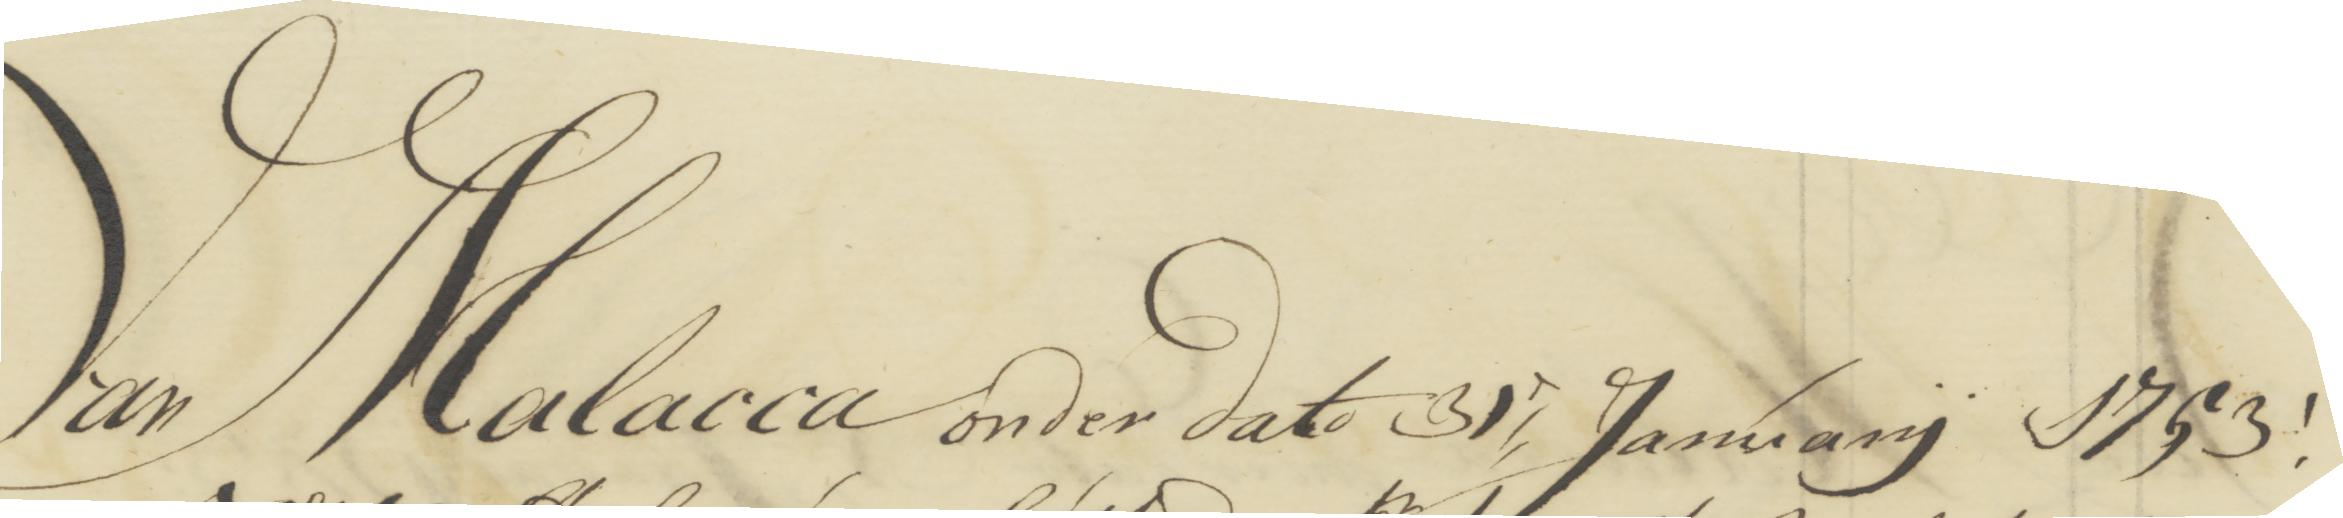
Van Malacca onder dato 31=e Januarij 1753.
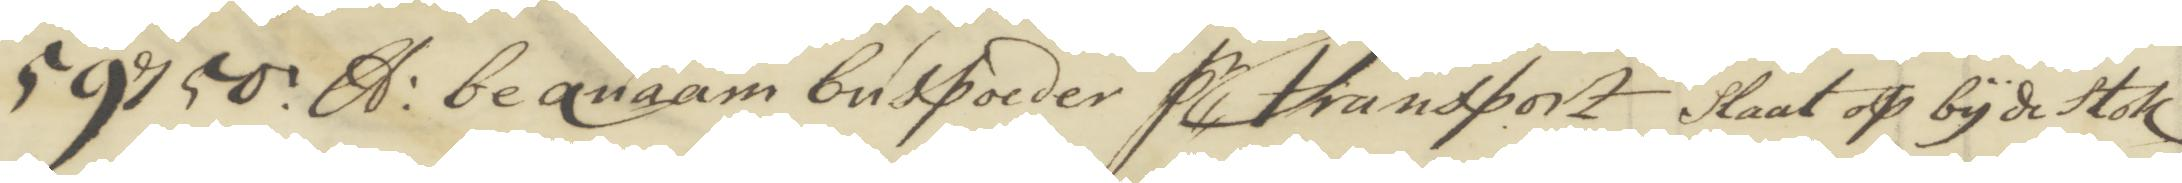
59750. lb: bequaam buspoeder p„r transport slaat op bij de stok
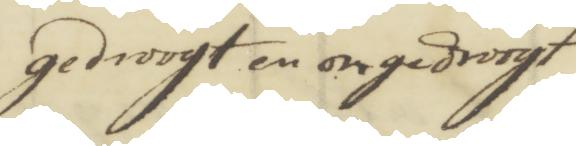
gedroogt en ongedroogt
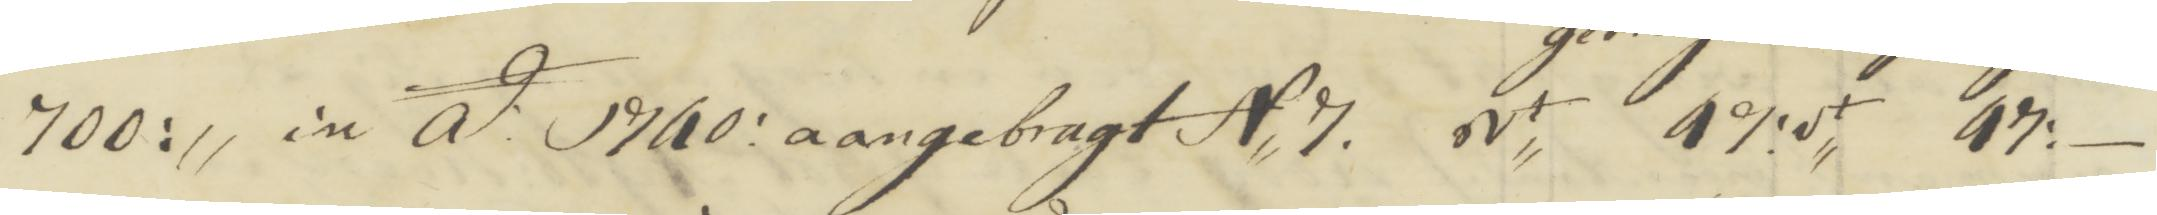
700: „ in a:o 1740: aangebragt N„7. N„t 47:s„t 47: —
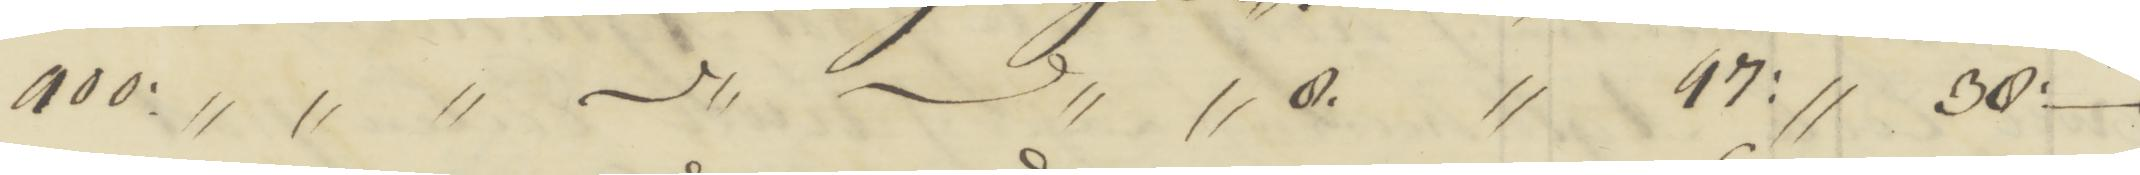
400: „ „ „ d„ d„ „ 8. „ 47: „ 38: —
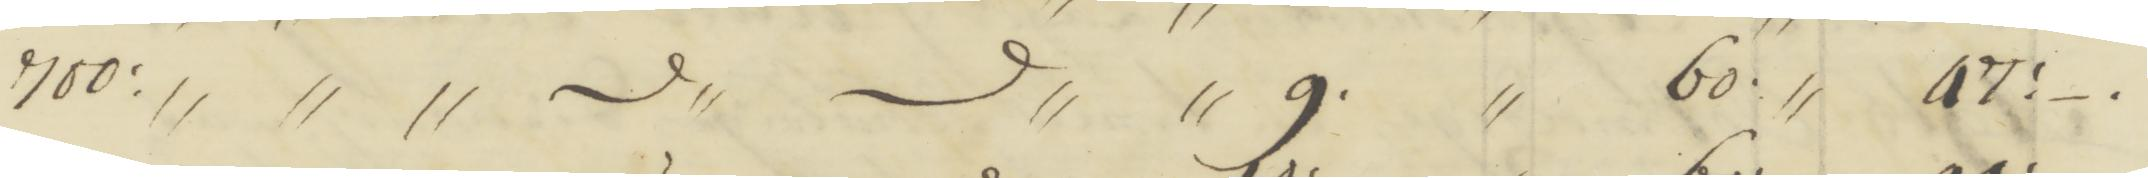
700: „ „ „ d„ d„ „ 9. „ 60: „ 47: —.
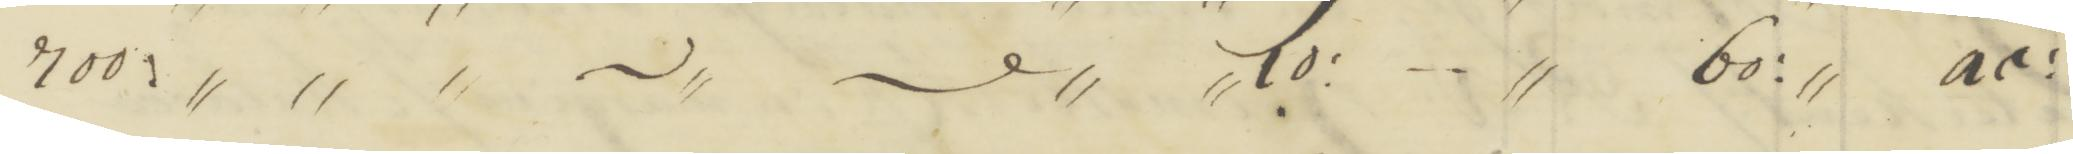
700: „ „ „ d„ d„ „10: - - 60: „ 45: —
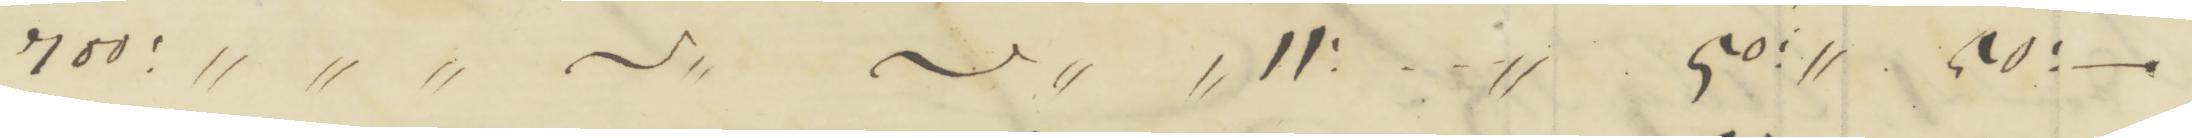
700: „ „ „ d„ d„ „11: - - - 50: „ 50: —
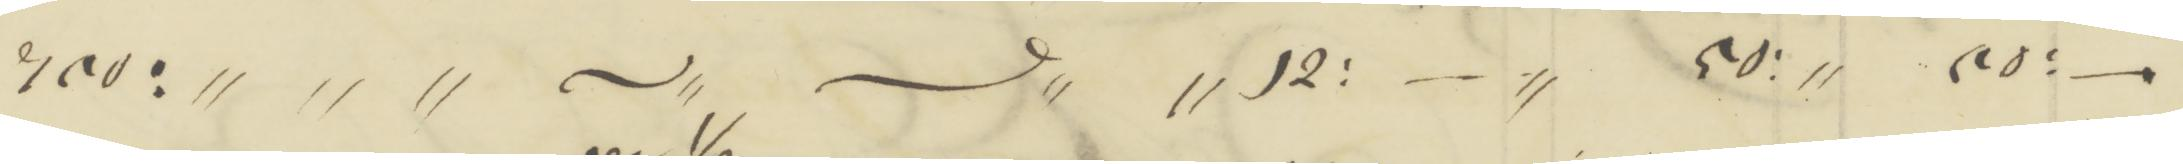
750: „ „ „ d„ d„ „12: — „ 50: „ 50: —
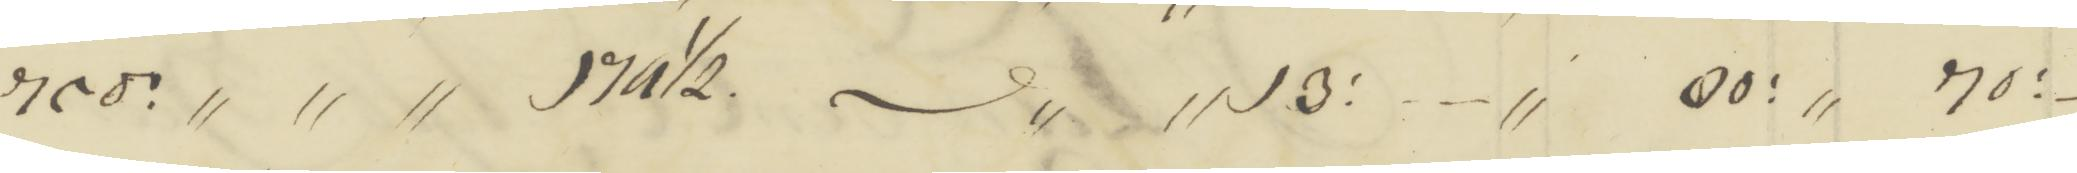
750: „ „ „ 174 ½. d„ „ 13: — „ 80: „ 70: —
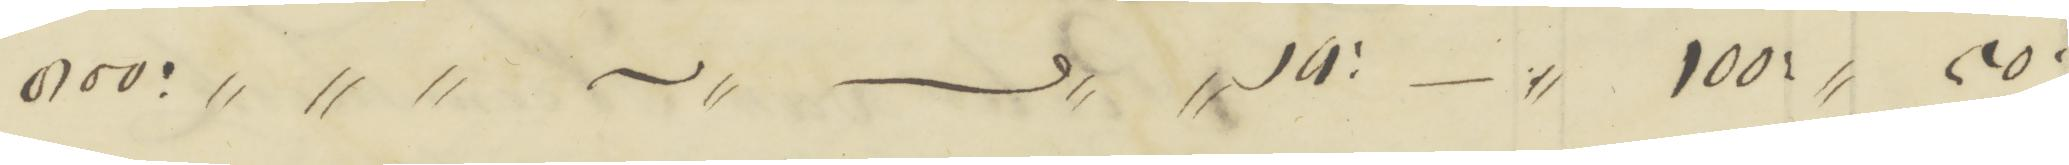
800: „ „ „ d„ d„ „14: — „ 100: „ 50: —
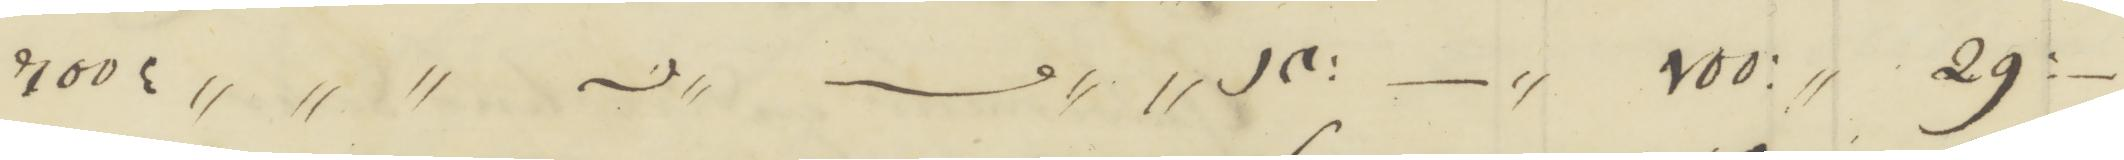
700: „ „ „ d„ d„ „ 15: — „ 100: „ 29: —
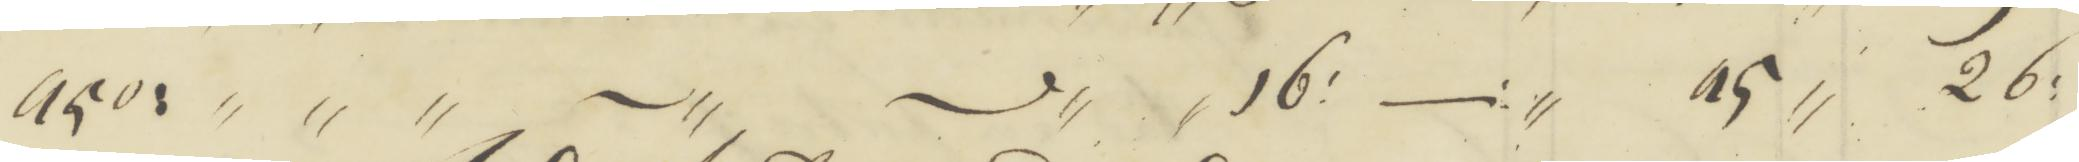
450: „ „ „ d„ d„ „ 16: —: „ 45 „ 26: —
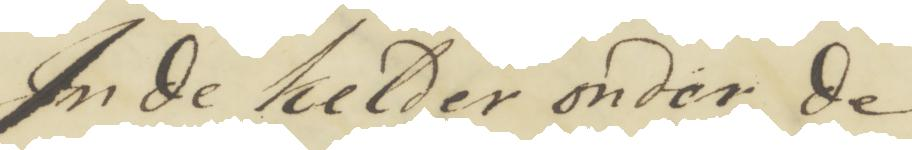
Jn de kelder onder de
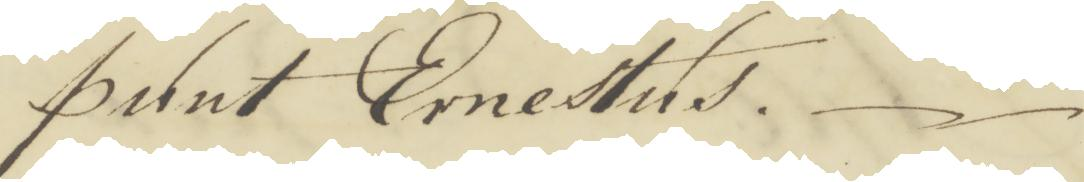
punt Ernestus. —
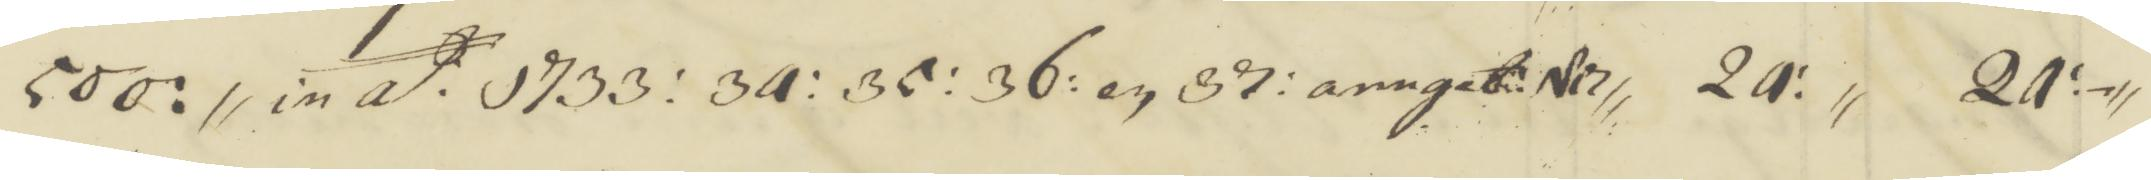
500: „ in a:o 1733: 34: 35: 36: en 37: anngeb:r Nt „ 24: „ 24: —„
